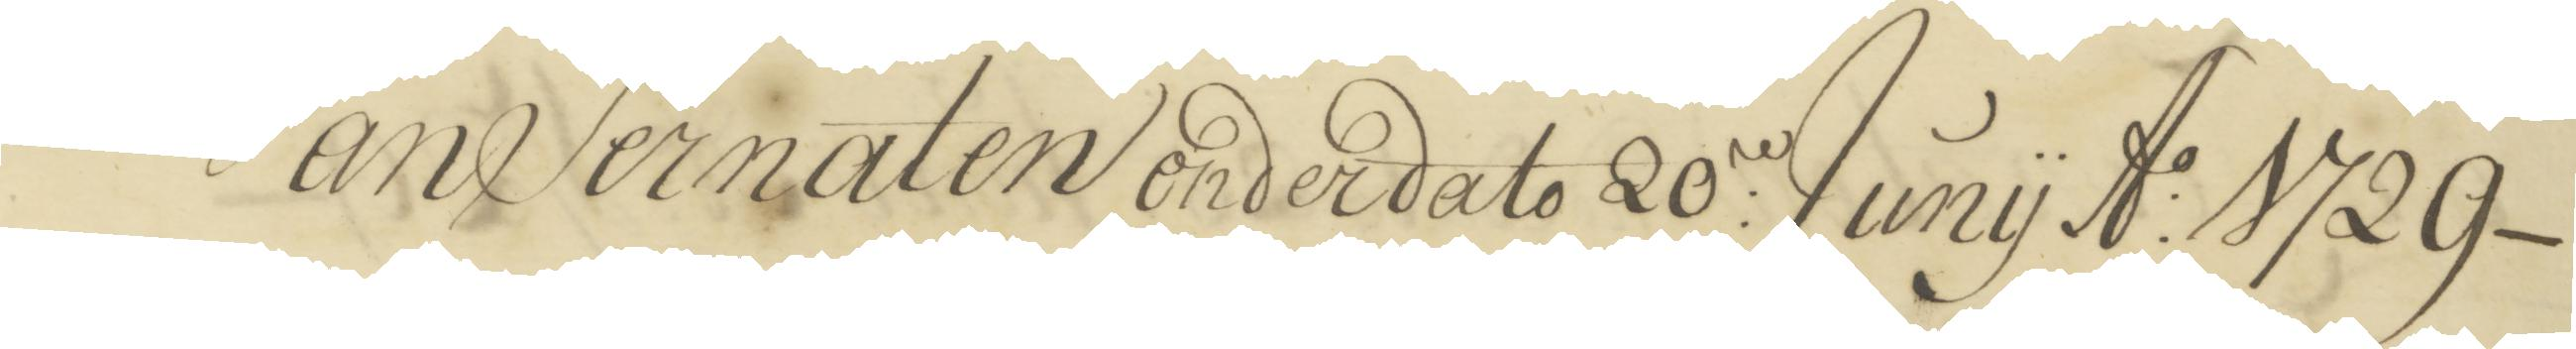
Van Ternaten onder dato 20:en Junij A:o 1729—
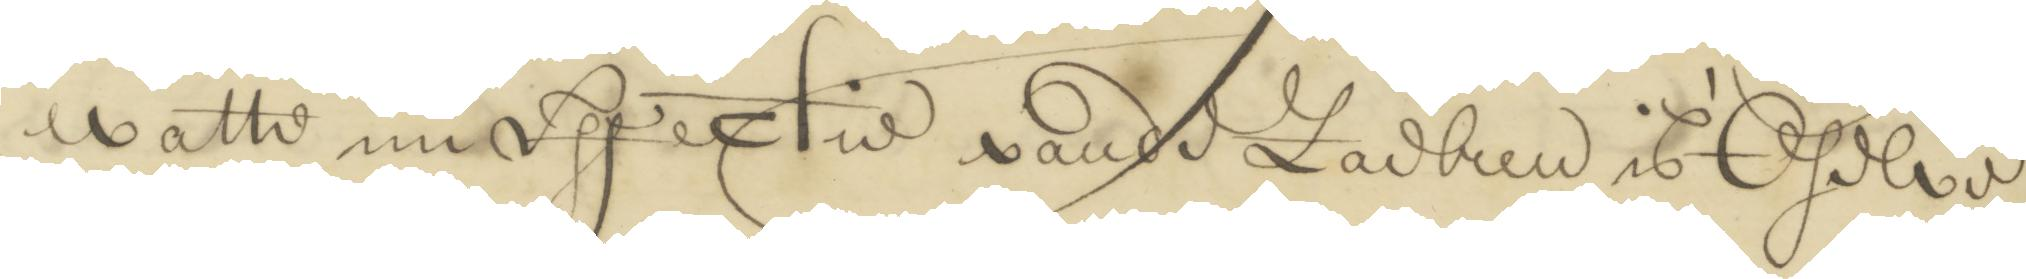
watte nu effectie van de zaeken is 'tselve
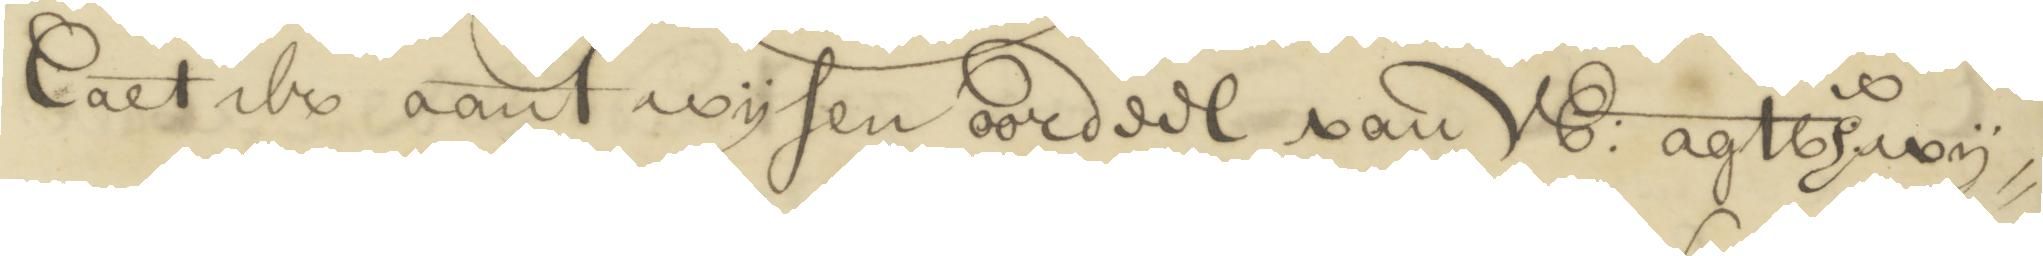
laet ik aan 't wijsen oordeel van VE: agtben wij„
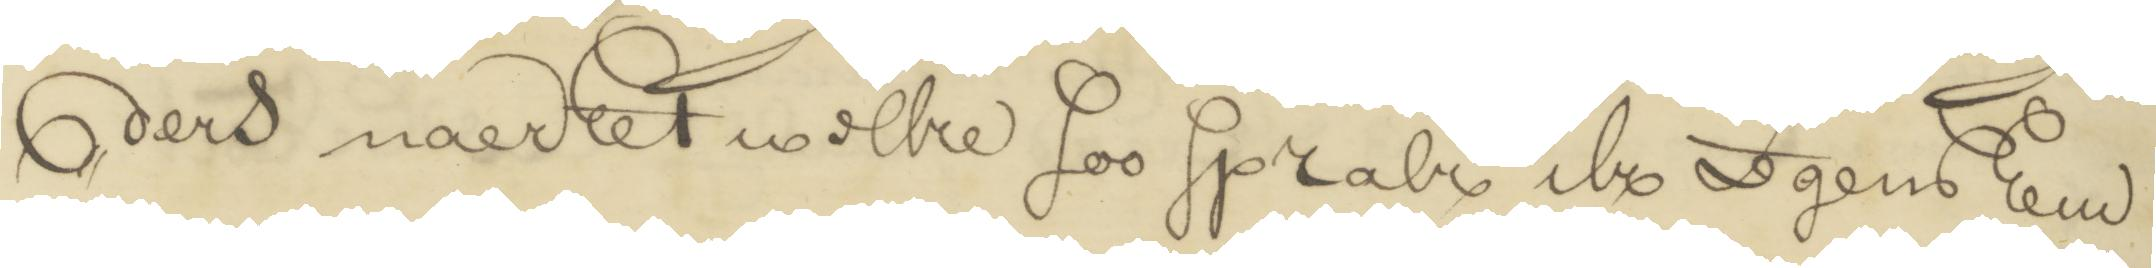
ders naer het welke soo sprak ik tegens hem
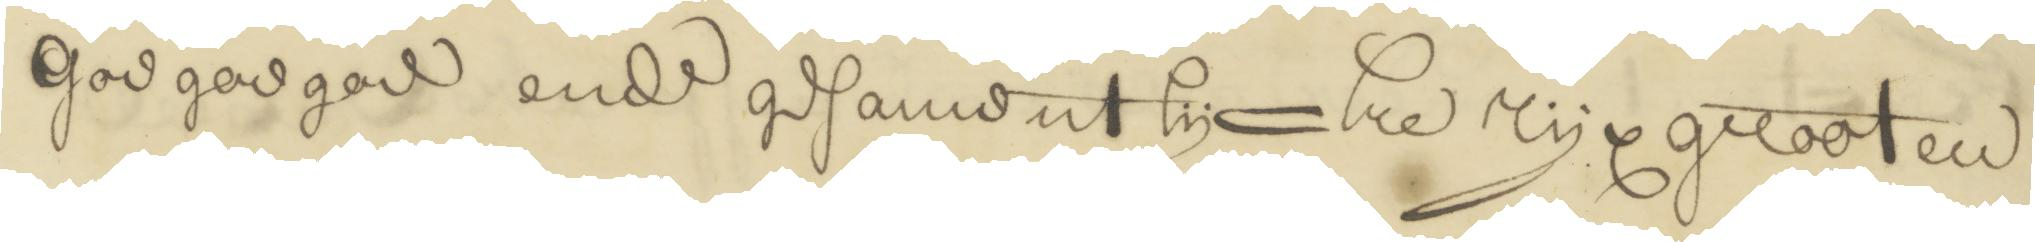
goegoegoe ende gesamentlijcke rijx grooten
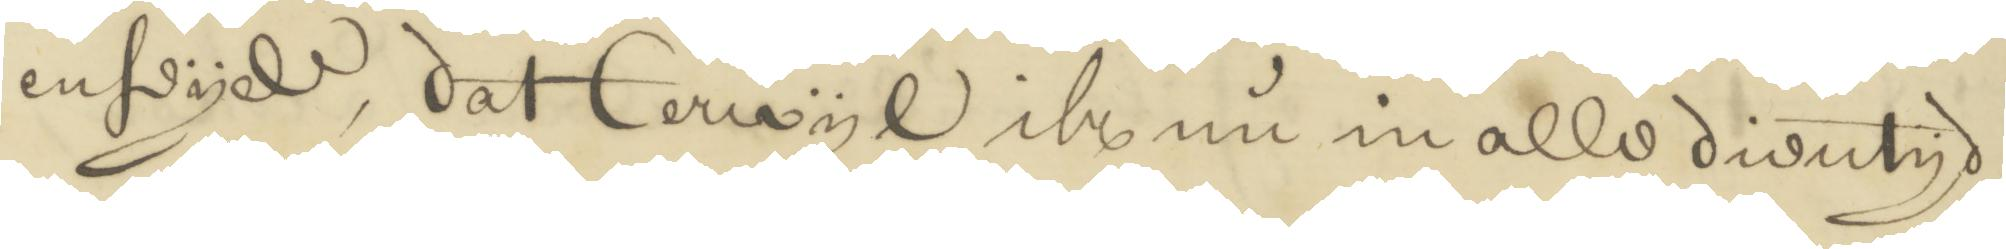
en seijde, dat terwijl ik nu in alle dientijd
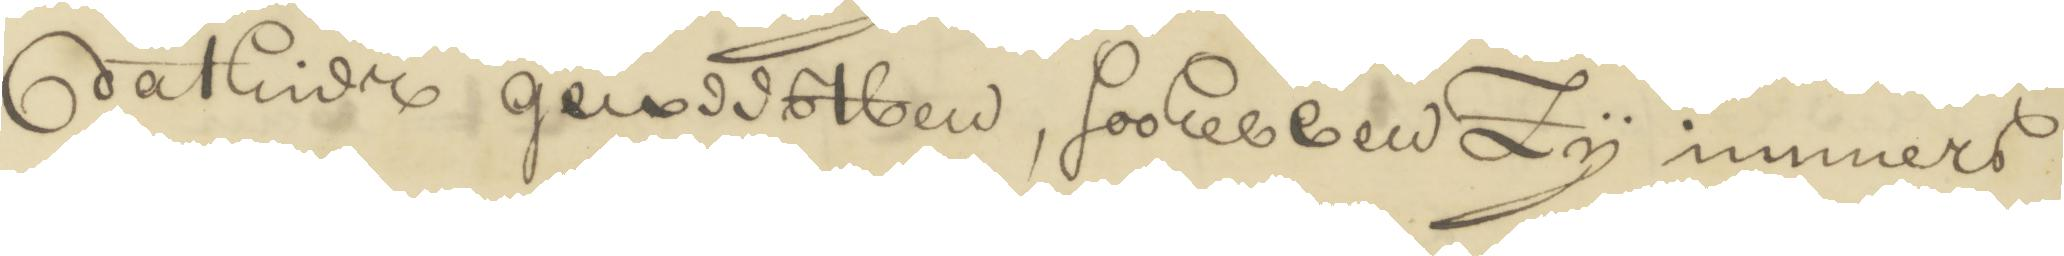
dat hier geweestben, soo hebben zij immers
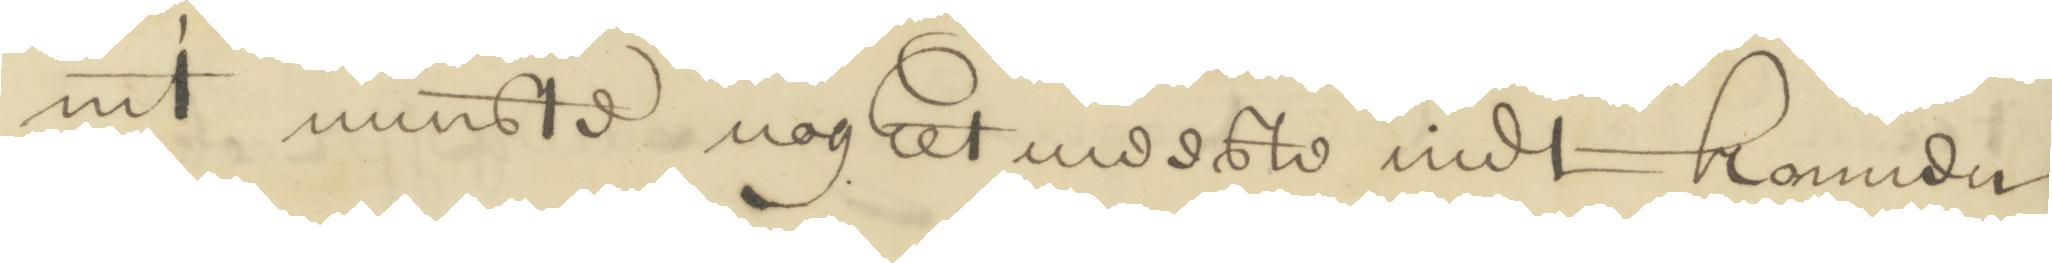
in 't minste nog het meeste niet konnen
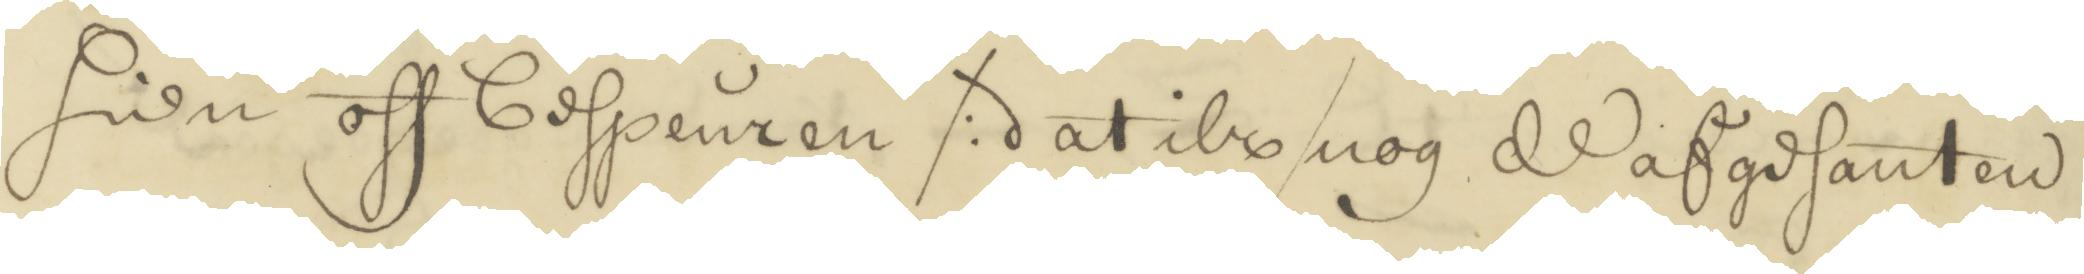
sien off bespeuren /:dat ik/ nog de afgesanten
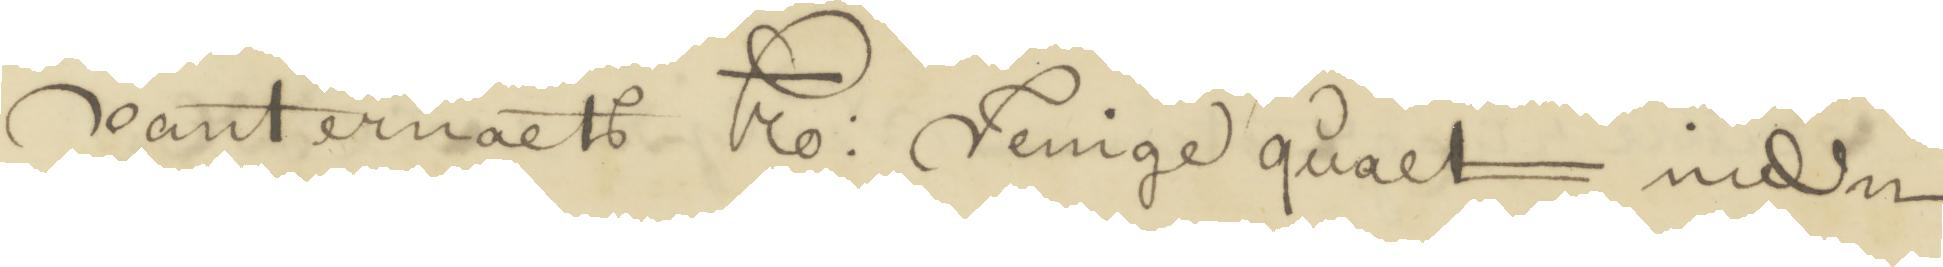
vanternaets ko: eenige quaet inden
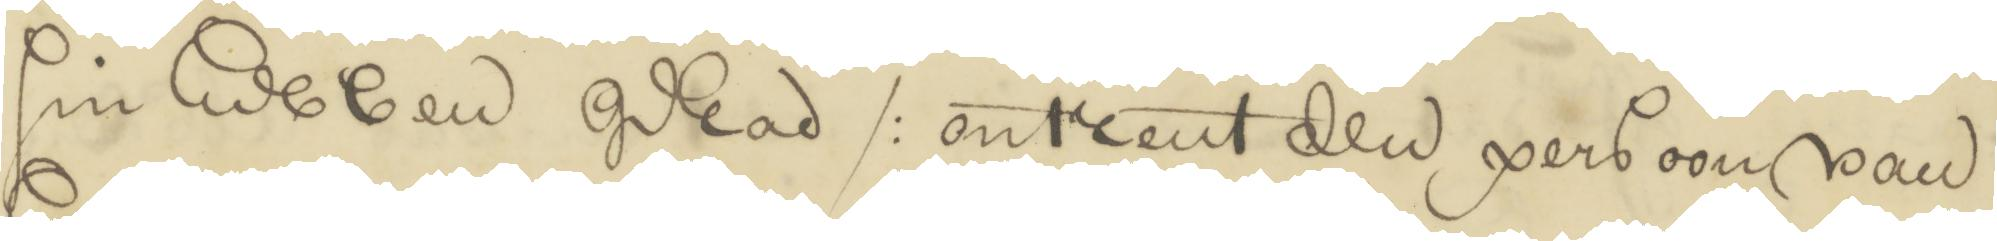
sin hebben gehad /:ontrent den persoon van
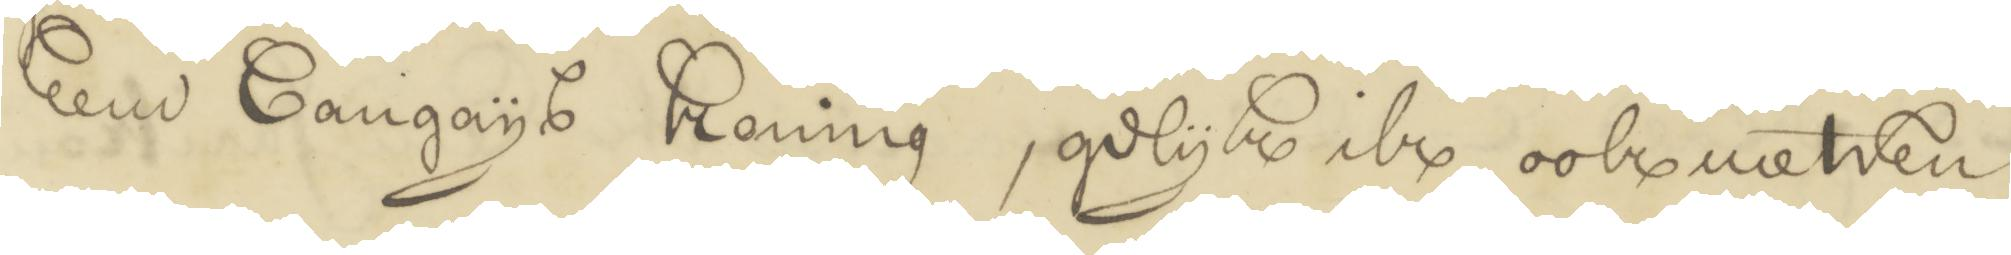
hem bangaijs koning, gelijk ik ook meteen
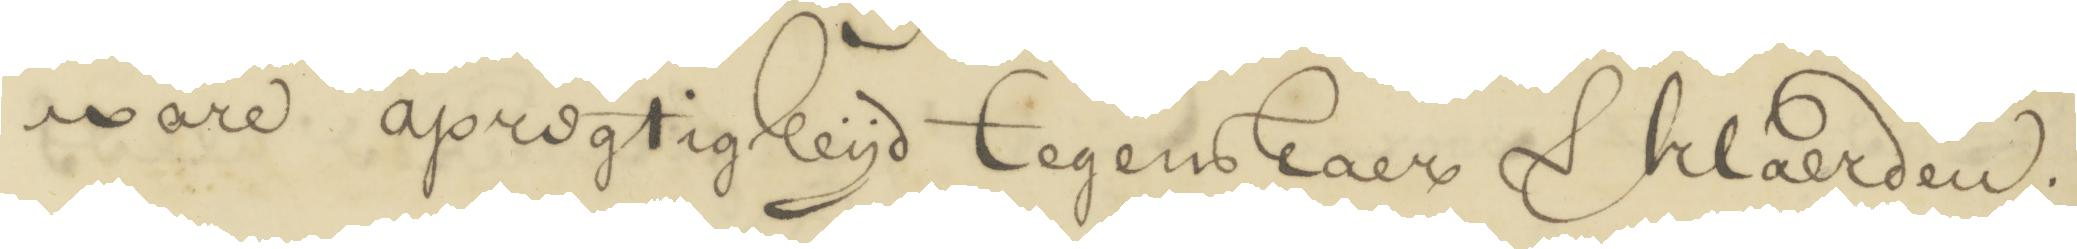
ware apregtigheijd tegenshaer verklaerden.
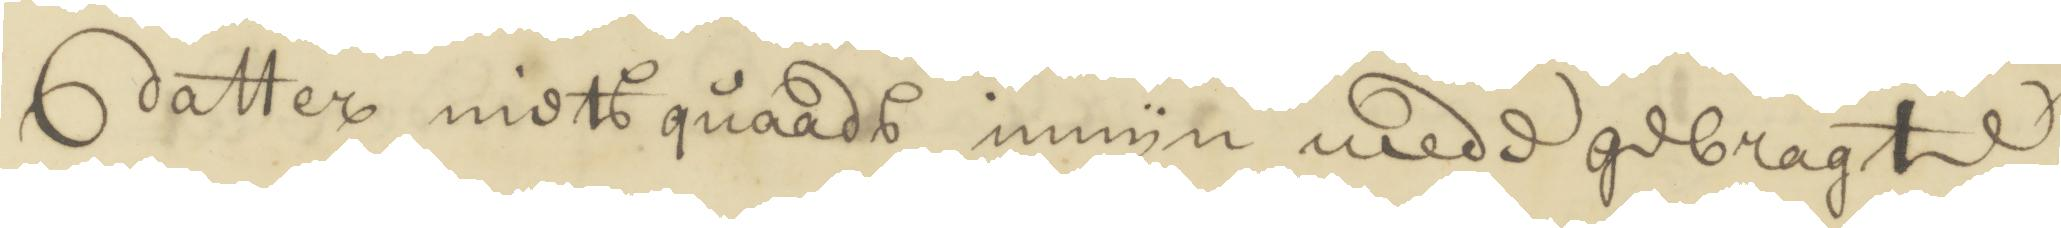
datter niets quaads innijn mede gebragte
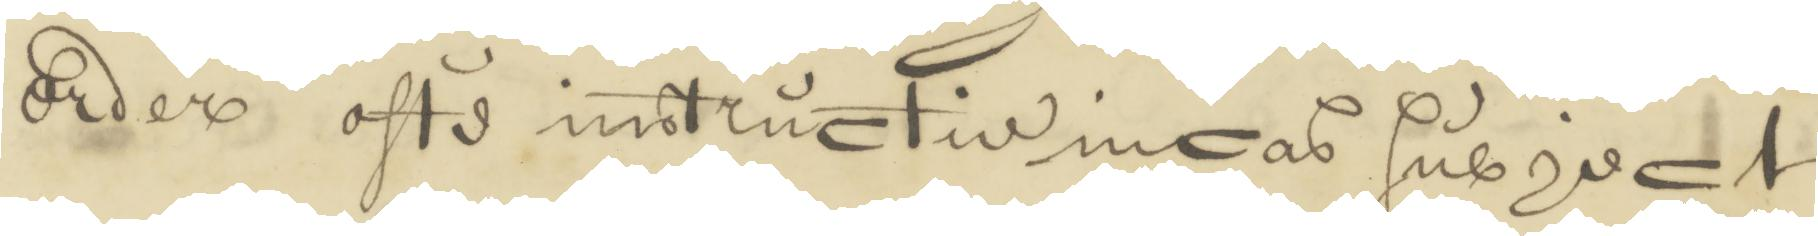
order ofte instructie incas subject
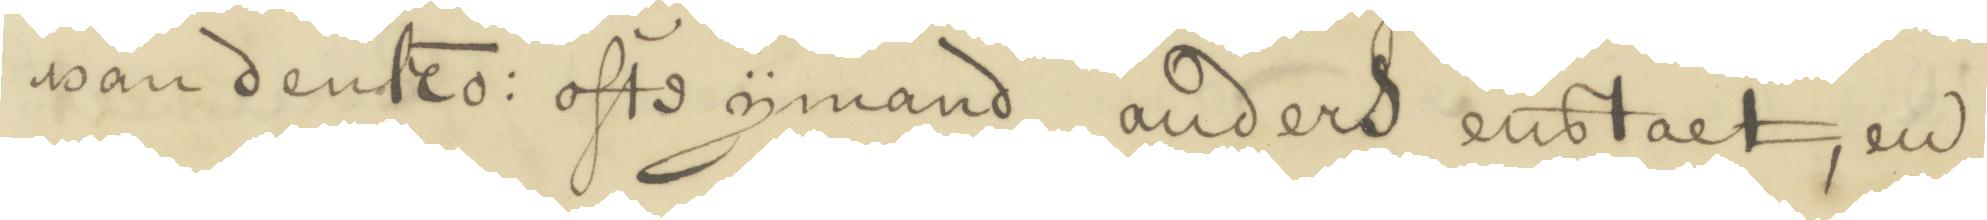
van denko: ofte ijmand anders enstaet, en
